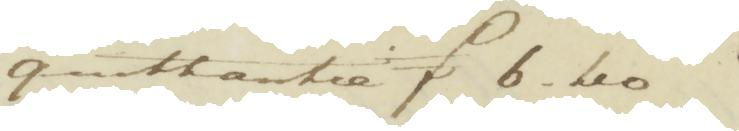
quittantie ƒ 6. 40
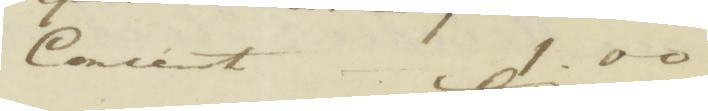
Concent 1.00
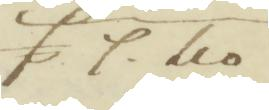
ƒ 7. 40
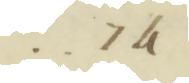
..74
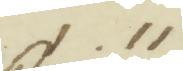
1 .11
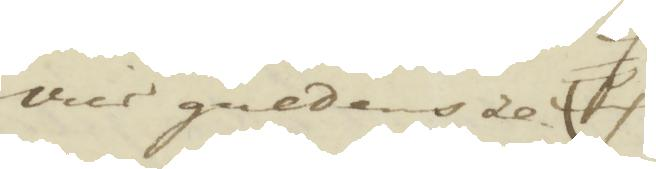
vier guldens ze
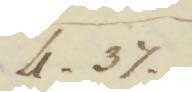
4„ 37.
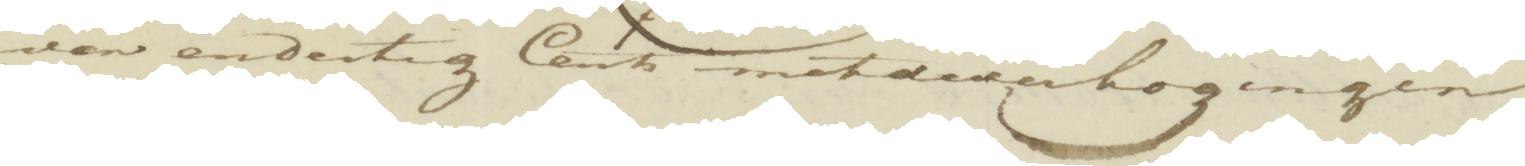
ven en dertig Cents met deverhogingen
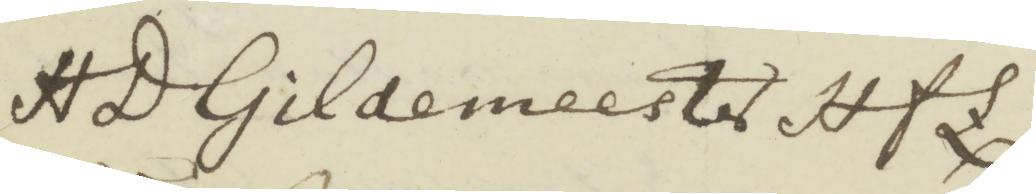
HD Gildemeeste HfL
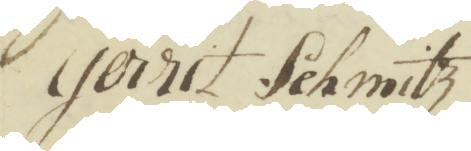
gerrit Schmitz
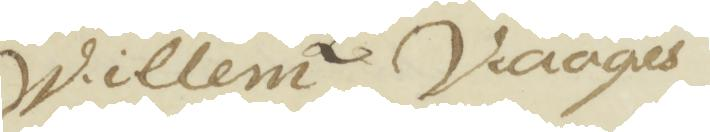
Willem Vaages
